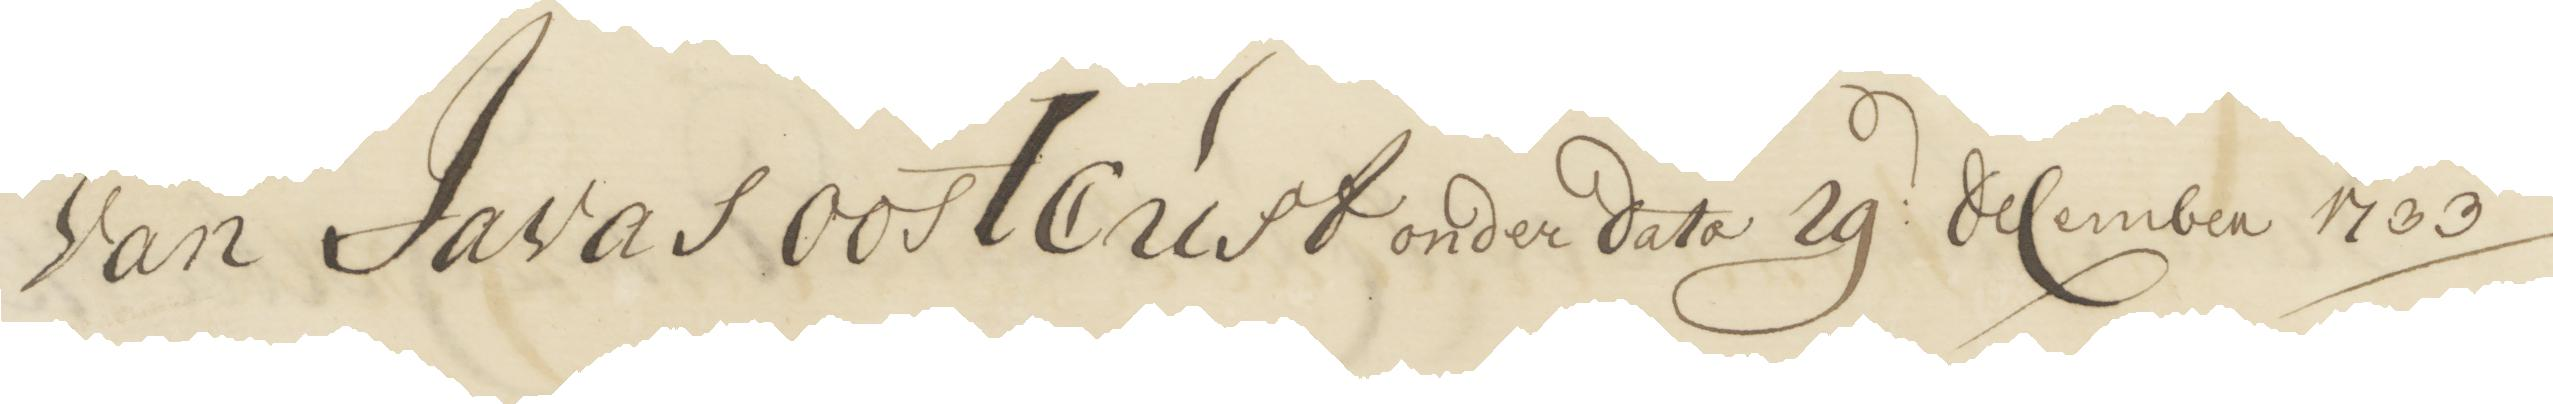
Van Iavas oost cust onder dato 29:' december 1733
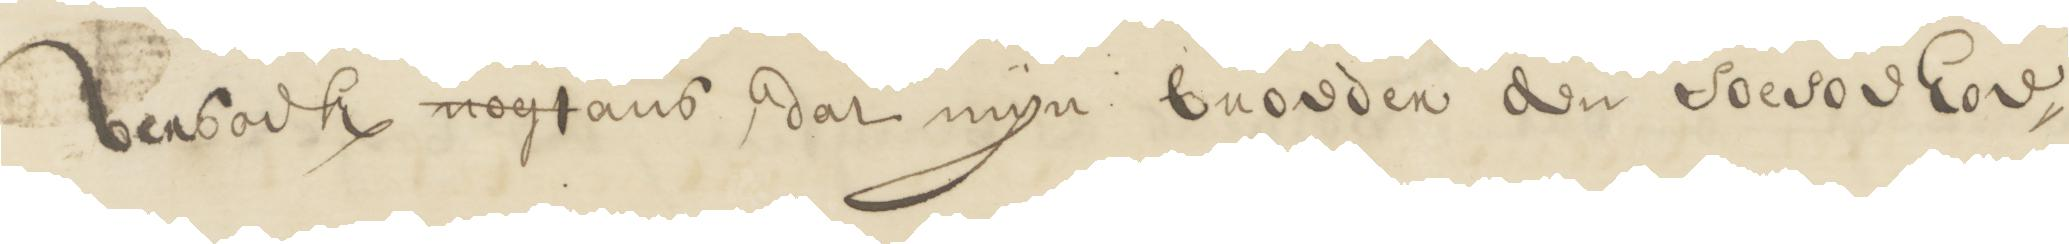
Versoek nogtans dat mijn broeder den soesoehoe„
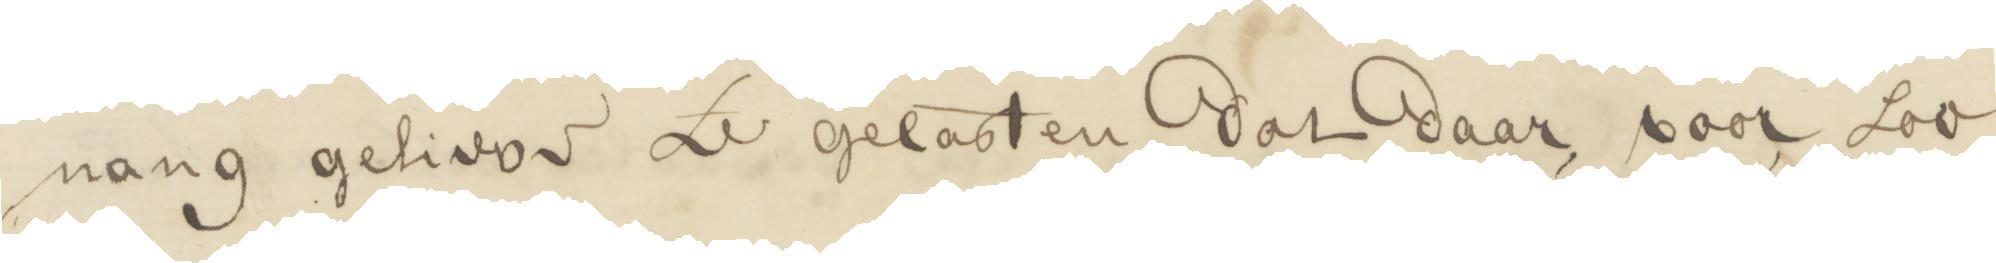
nang gelieve te gelasten dat daar voor soo
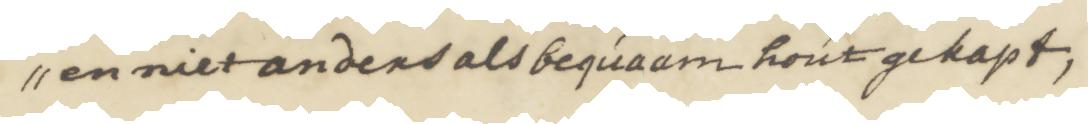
„ en niet anders als bequaam hout gekapt,
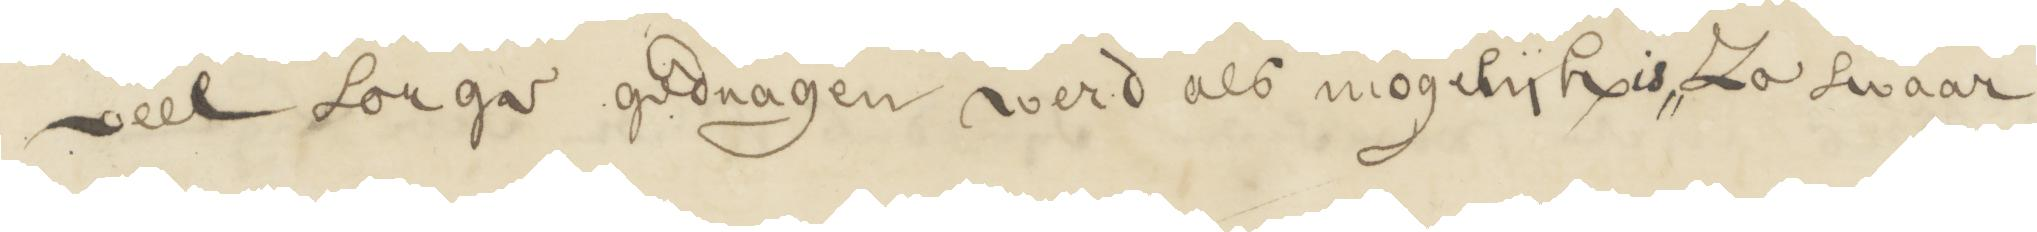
veel sorge gedragen werd als mogelijk is „ zo swaar
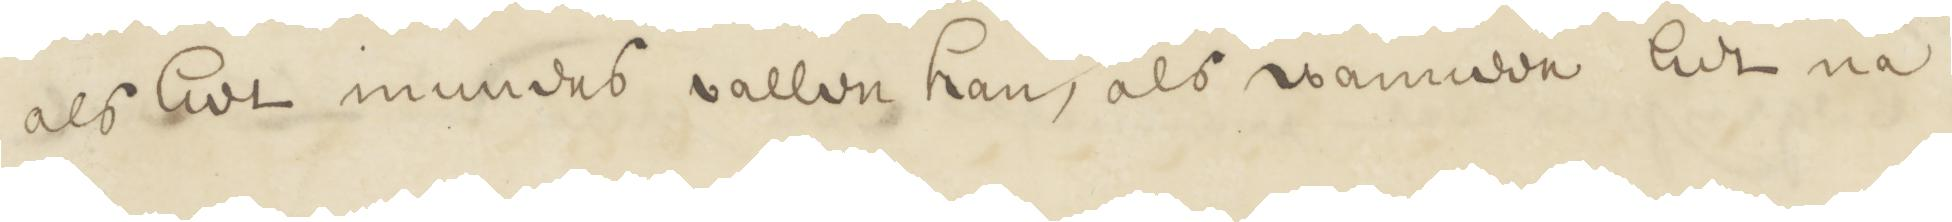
als het immers vallen kan, als wanneer het na
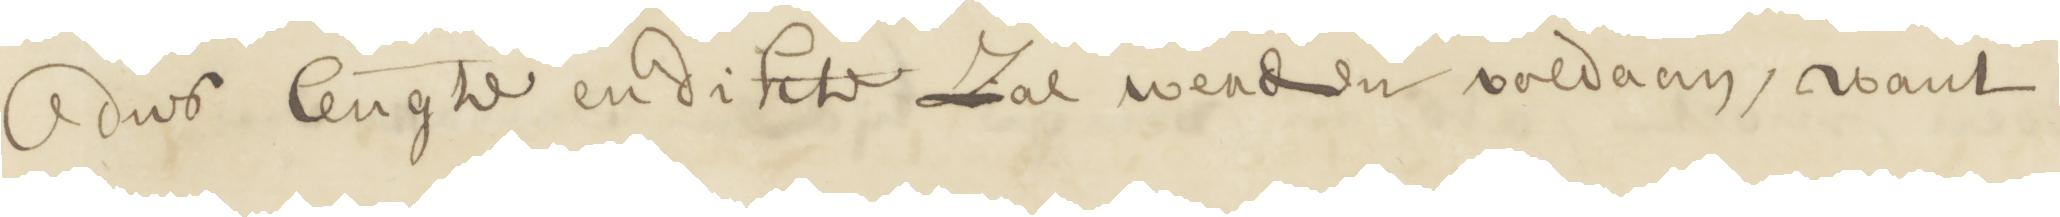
dies lengte en dikte zal werden voldaan, want
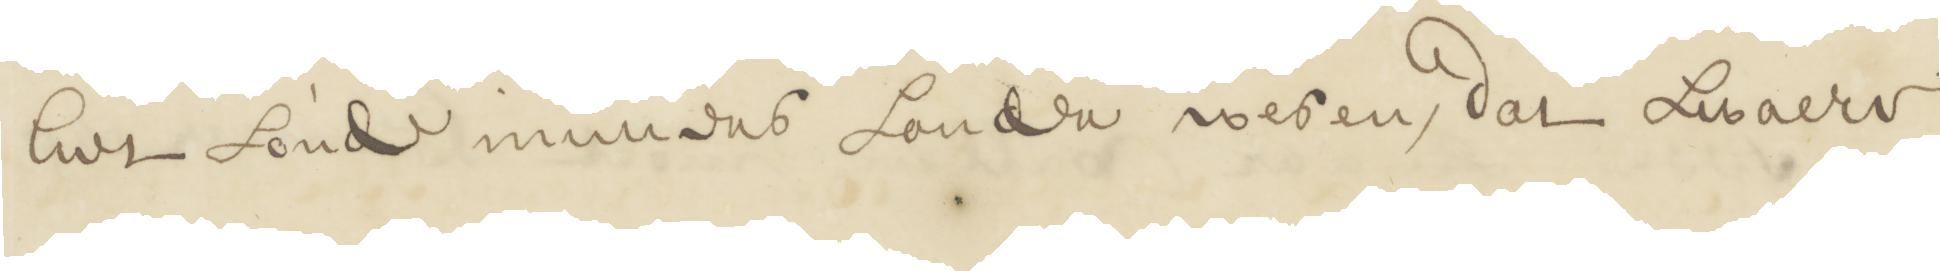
het soude immers sonder wesen, dat swaere
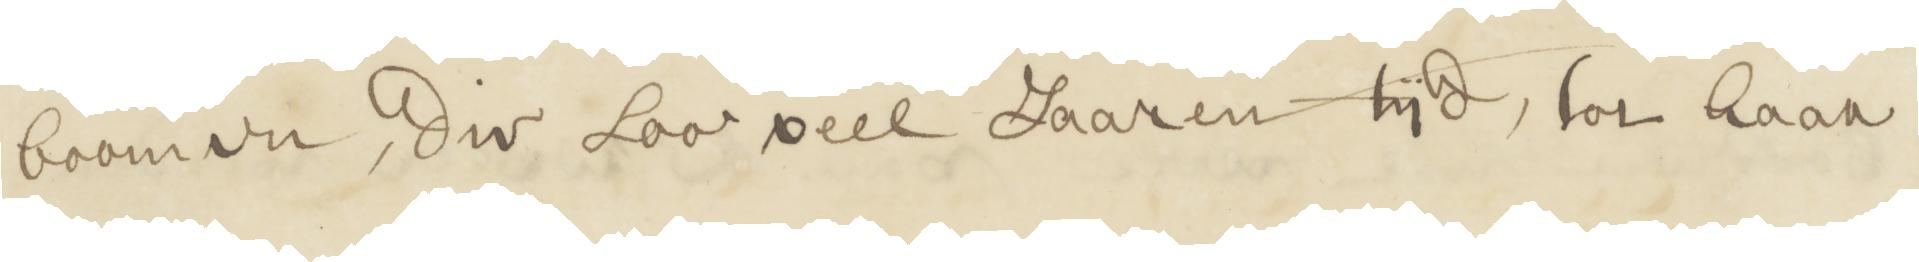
boomen, die soo veel Iaaren tijd, tot haar
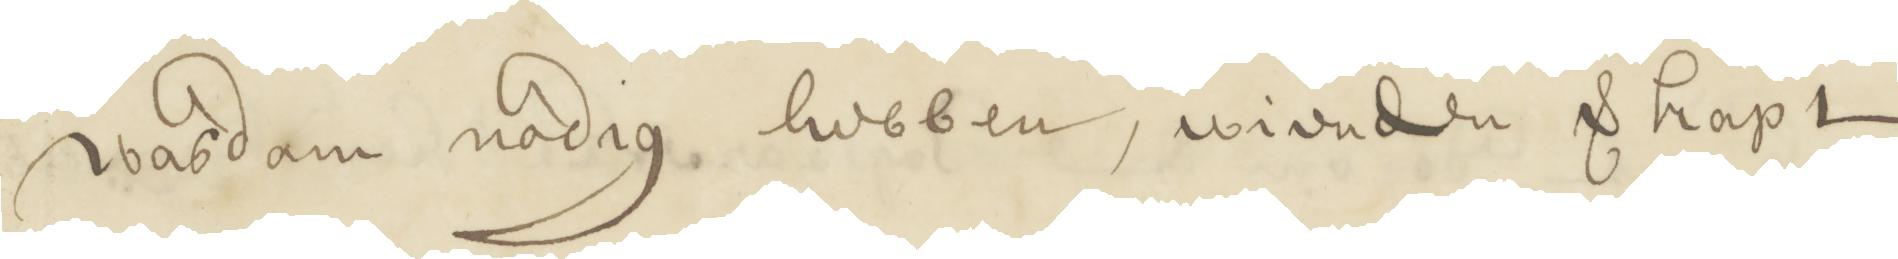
wasdom nodig hebben, wierden verkapt
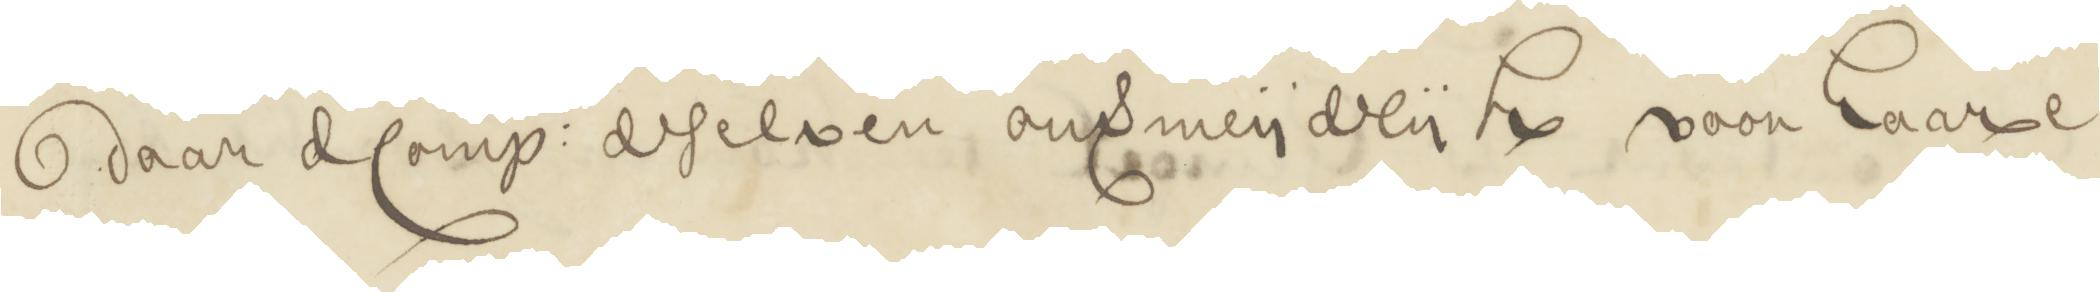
daar d Comp: deselven onvermeijdelijk voor haare
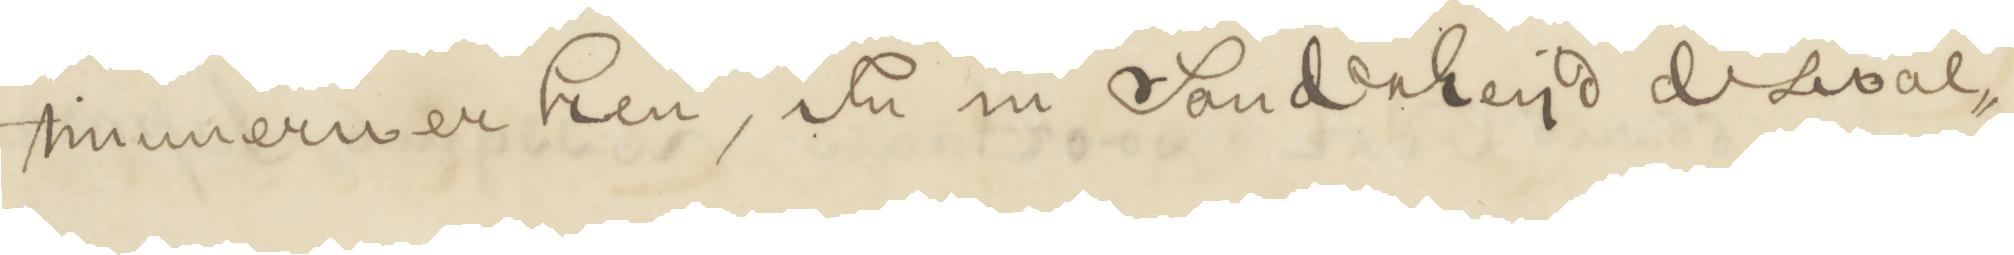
timmerwerken, en in sonderheijd de swal„
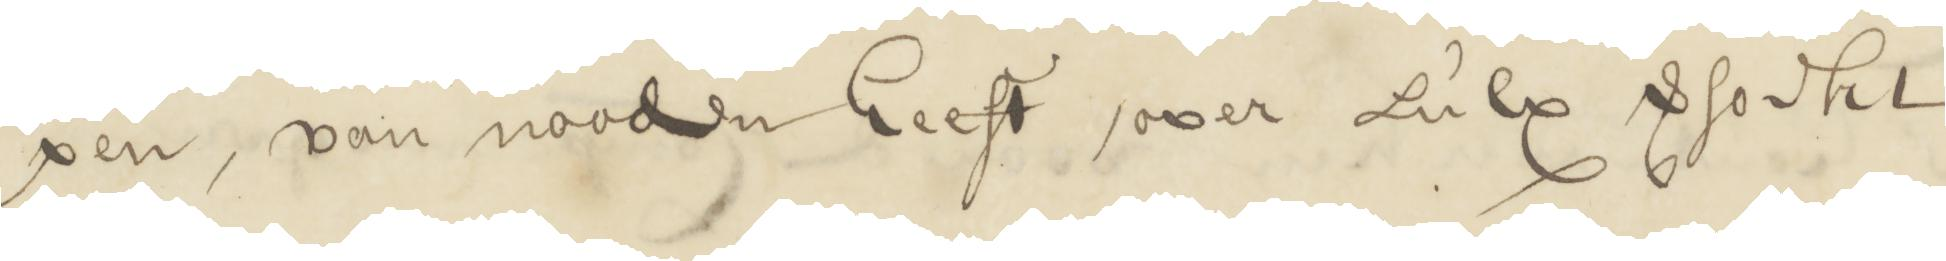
pen, van nooden heeft, over sulx versoekt
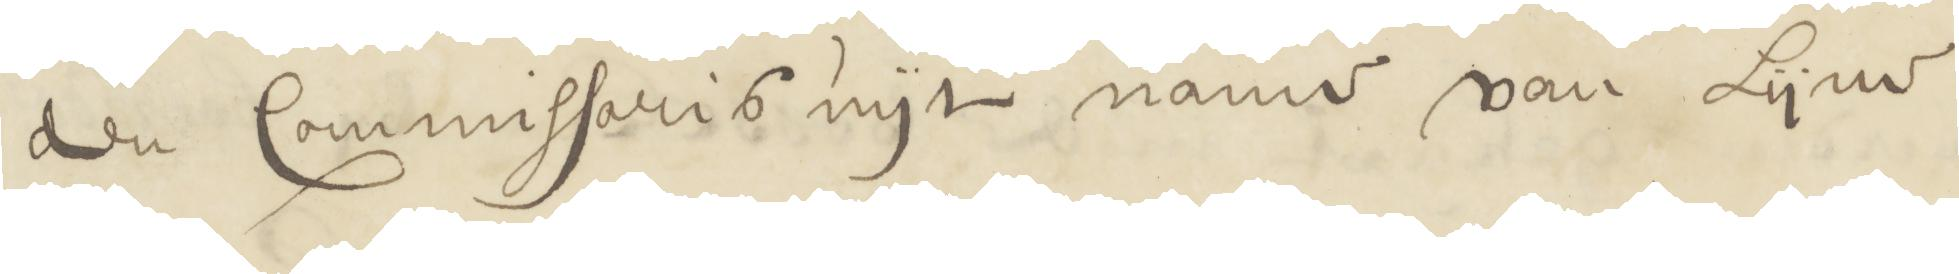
den Commissaris uijt name van sijne
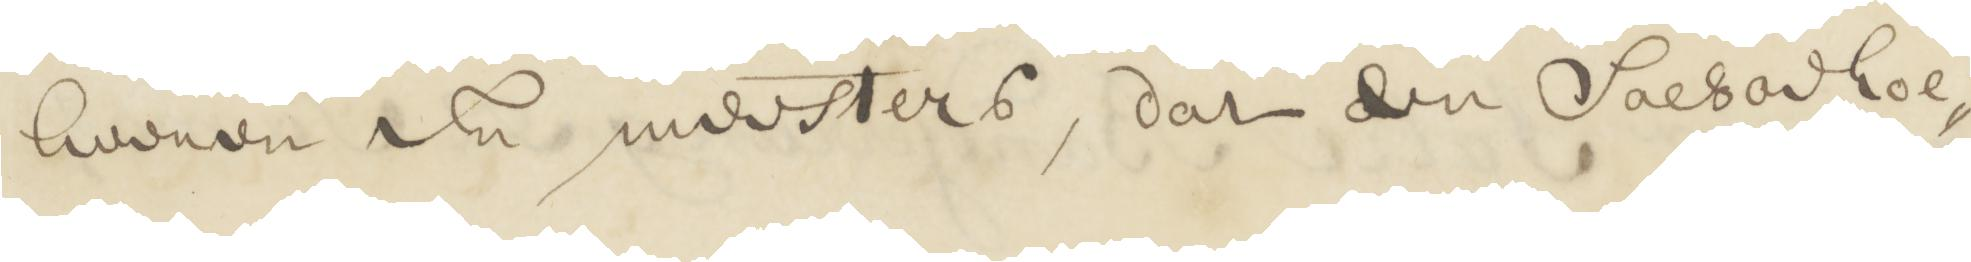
heeren en meesters, dat den soesoehoe„
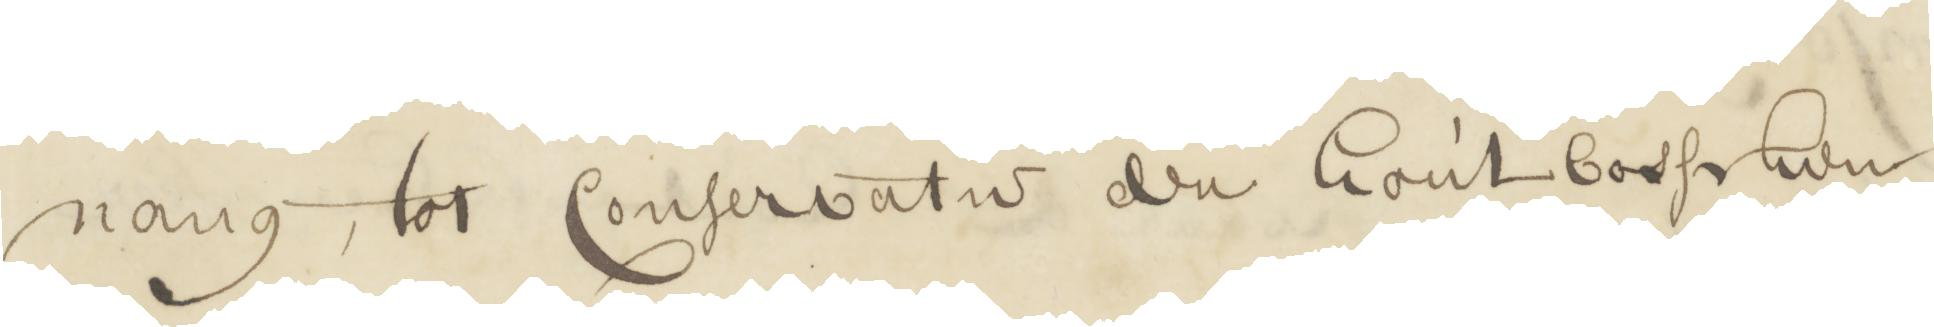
nang, tot Conservatie der hout bosschen
